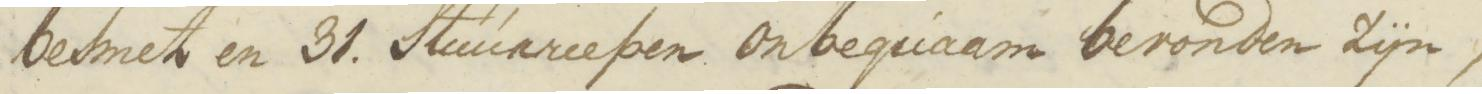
besmet en 31. stuurreepen onbequaam bevonden zijn,
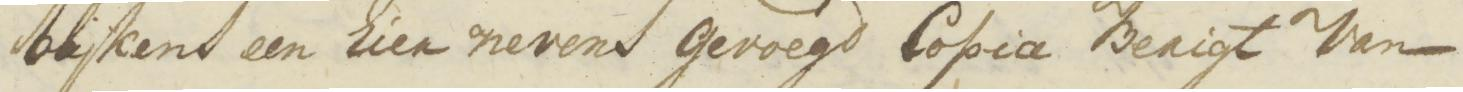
blijkens een hier nevens gevoegd Copia Berigt van
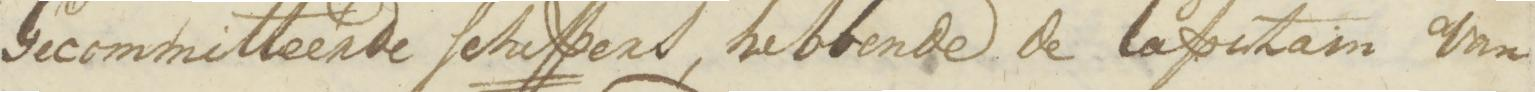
Gecommiteerde schippers, hebbende de Capitain van
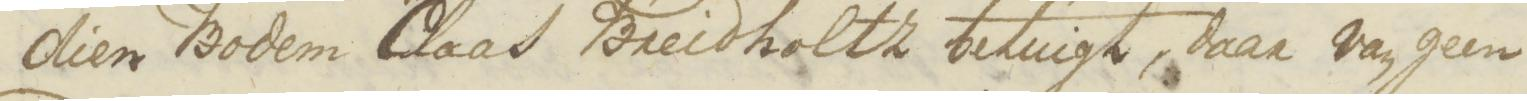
dien Bodem Claas Breidholtz betuigt, daar van geen
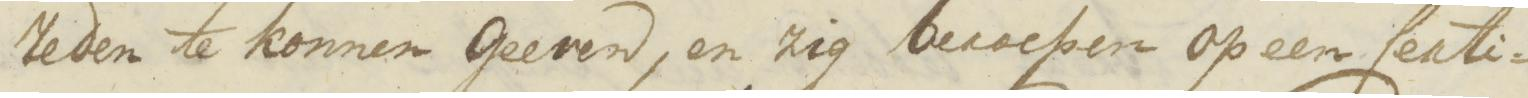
reden te konnen geeven, en zig beroepen op een Certi„
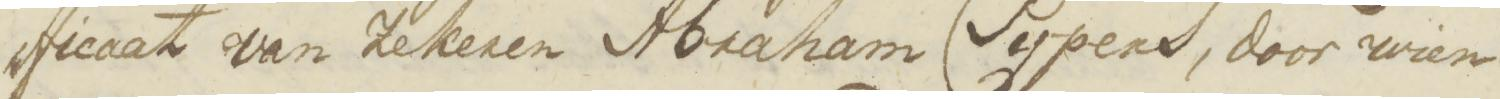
„ficaat van zekeren Abraham Pypers, door wien
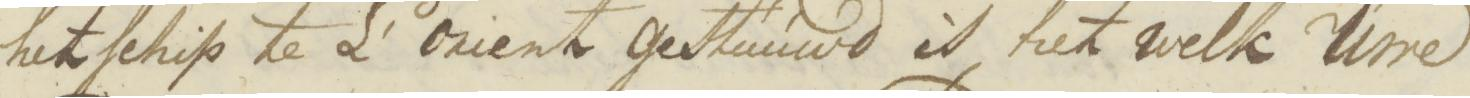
het schip te L'Orient gestuurd is, het welk Uwe
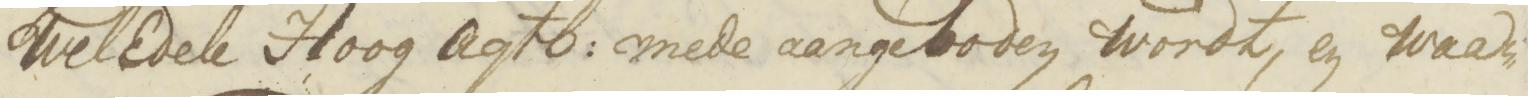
WelEdele Hoog agtb: mede aangeboden wordt, en waar„
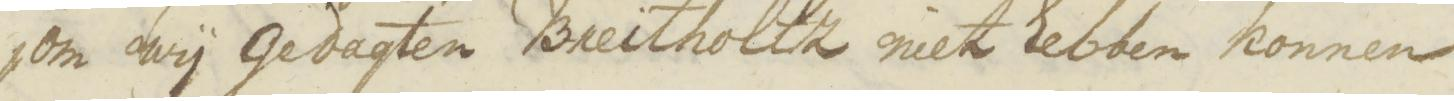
„om wij gedagten Breitholtz niet hebben konnen
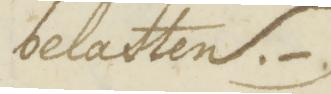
belasten.-
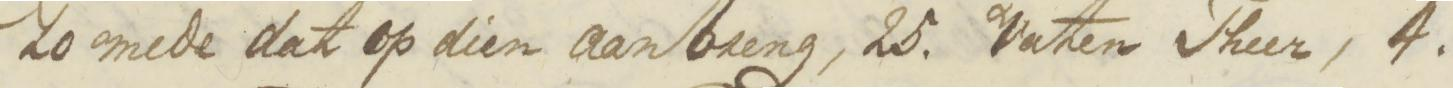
Zo mede dat op dien aanbreng, 25. Vaten Theer, 4.
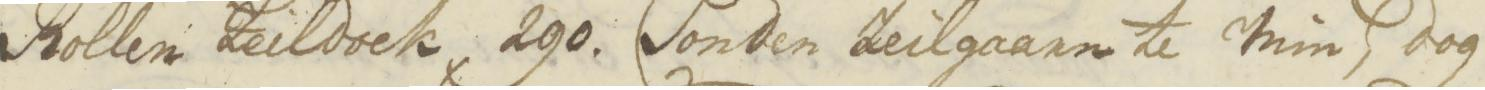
Rollen Zeildoek, 290. Ponden Zeilgaarn te min dog
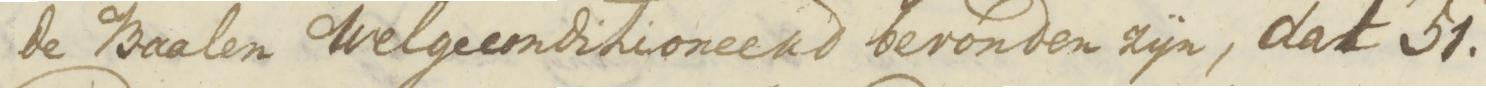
de Baalen Welgeconditioneerd bevonden zijn, dat 51.
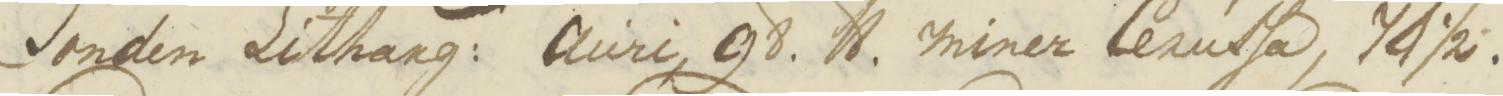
Ponden Litharg: Auri, 98. lb miner Cerussa, 74½.
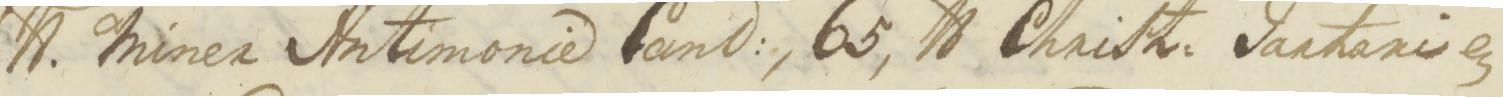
lb miner Antimonie Cand:, 65, lb Christ: Tartari en
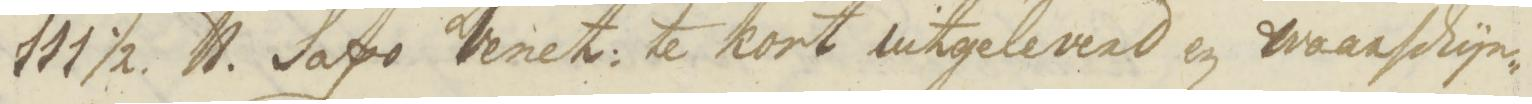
111½ lb Sapo Venet te kort uitgeleverd en waarschijn„
